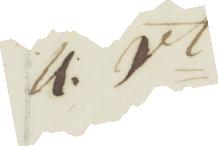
4. v=t
